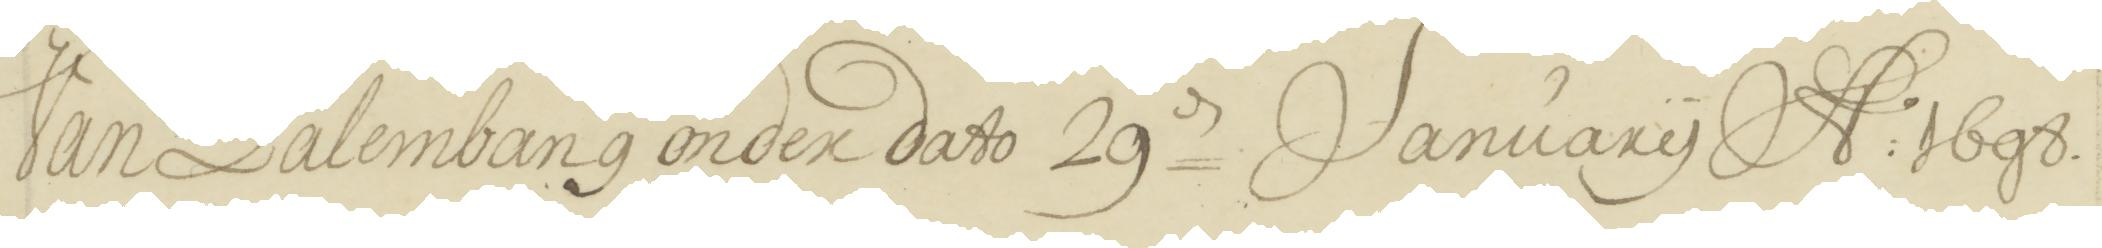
Van Palembang onder dato 29=en Ianuarij A:o 1698.
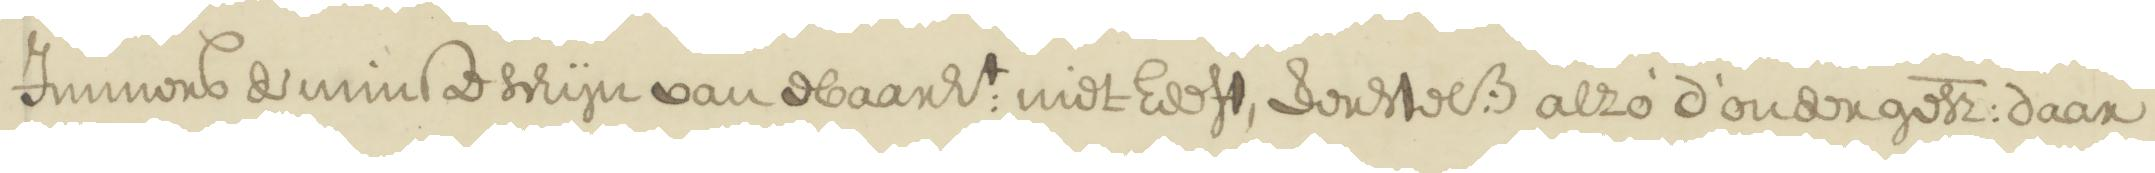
Immers de minste schijn van waarh:t niet heeft, Eerstelijk alzo d’ ondergesz: daar
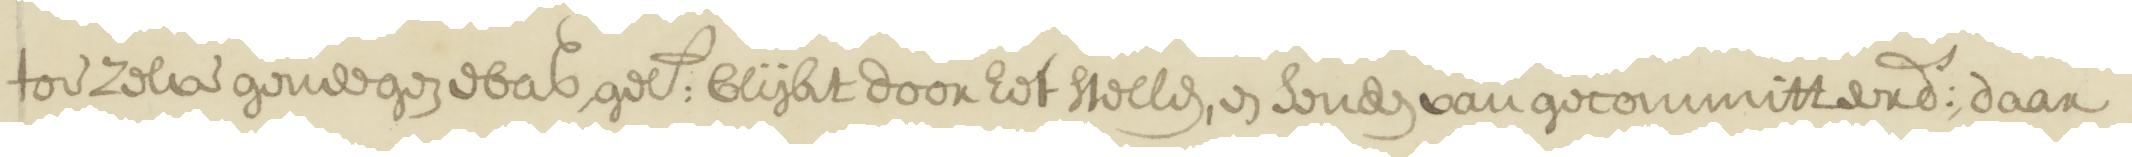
toe Zelve geneegen was gelijk blijkt door het stellen, en senden van gecommitteerd:s daar
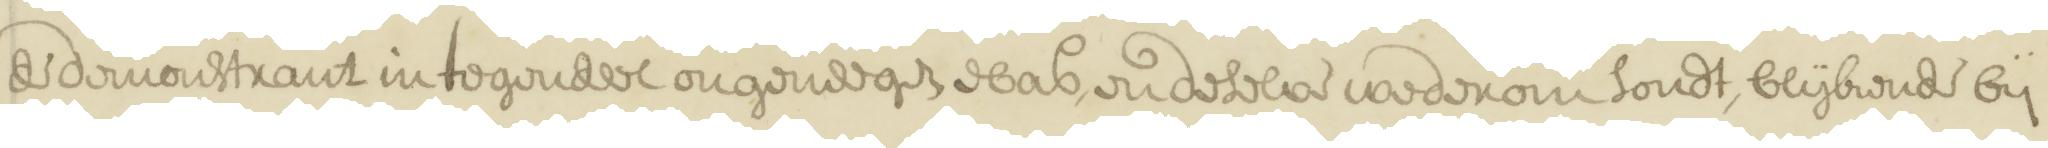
de demonstrant in tegendeel ongeneegen was, en deselve wederom sondt, blijkende bij
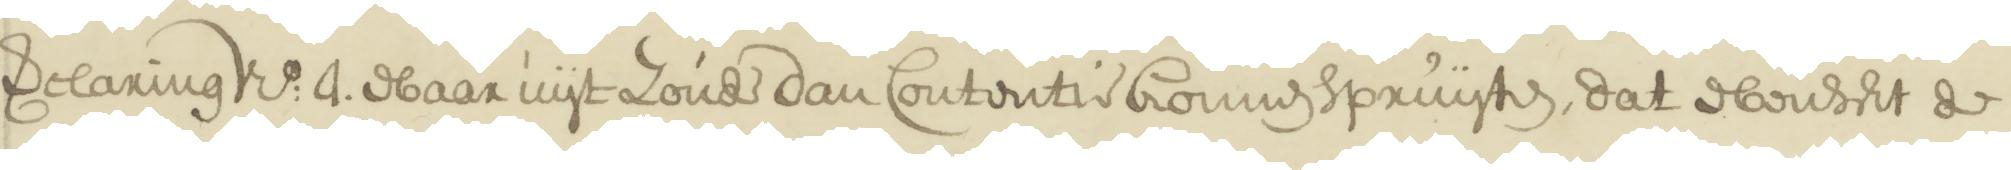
verclaring N:o 4. waar uijt Zoude dan Contentie konnen spruijten, dat wenscht de
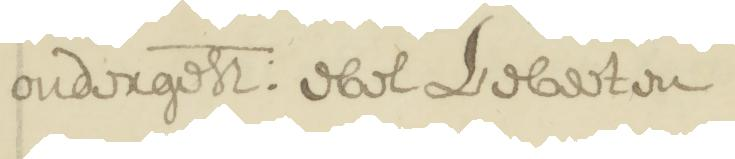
ondergesz: wel te weeten
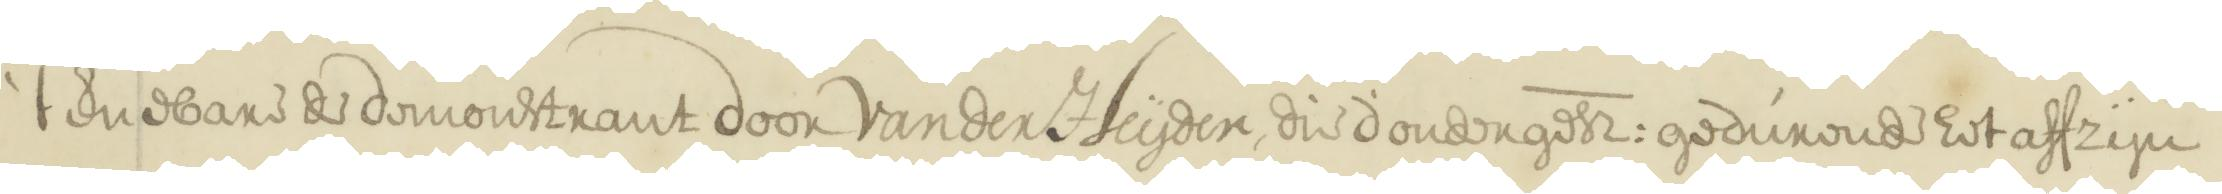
't En ware de demonstrant door van der Heijden, die d'ondergesz: gedurende het affzijn
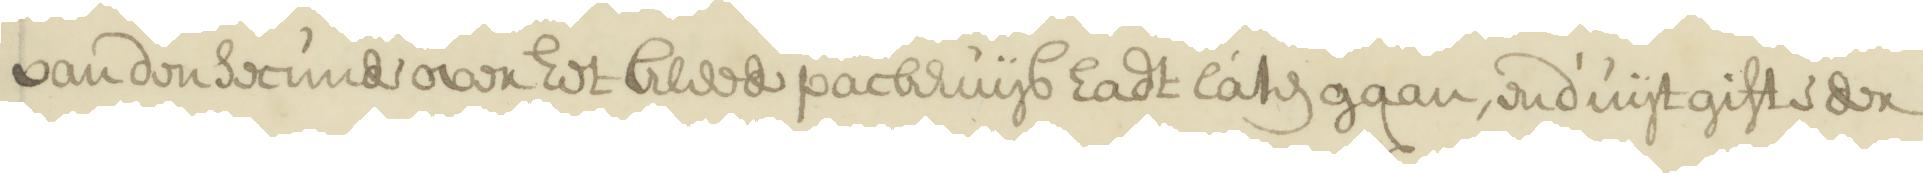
van den secunde over het kleede packhuijs hadt laten gaan, en d' uijtgifte der
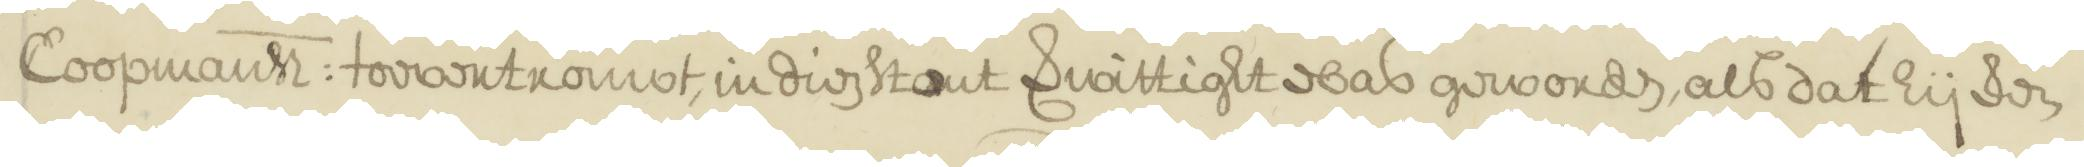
Coopmansz: toevertrouwt, in dien stont verwittight was geworden, als dat hij Een
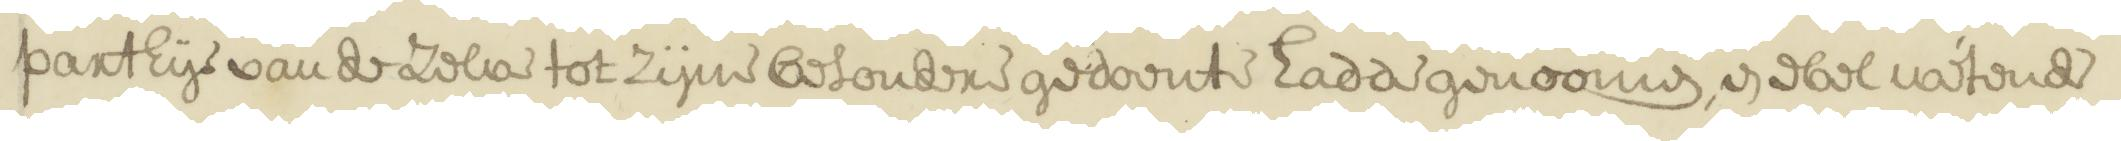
parthijs van de zelve tot Zijne besondere gedoente hadde genoomen, en wel wetende
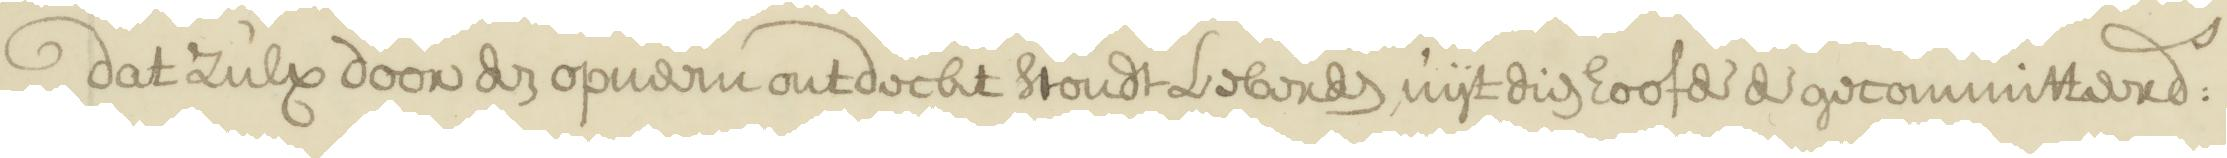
dat Zulx door den opneem ontdeckt stondt te werden uijt dien hoofde de gecommitteerd:s
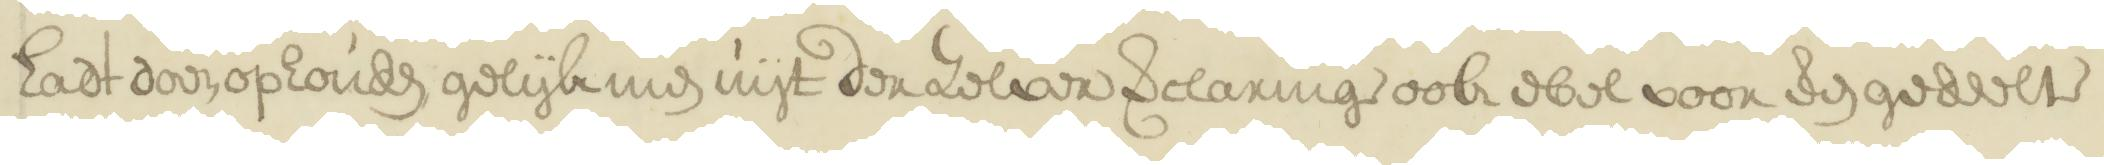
hadt doen ophouden gelijk men uijt der Zelver verclaringe ook wel voor een gedeelte
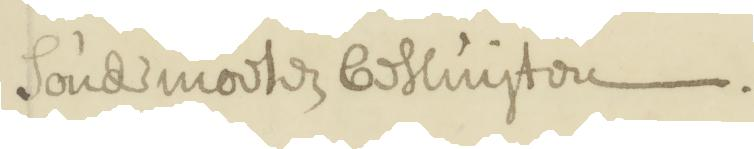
Soude moeten besluijten.
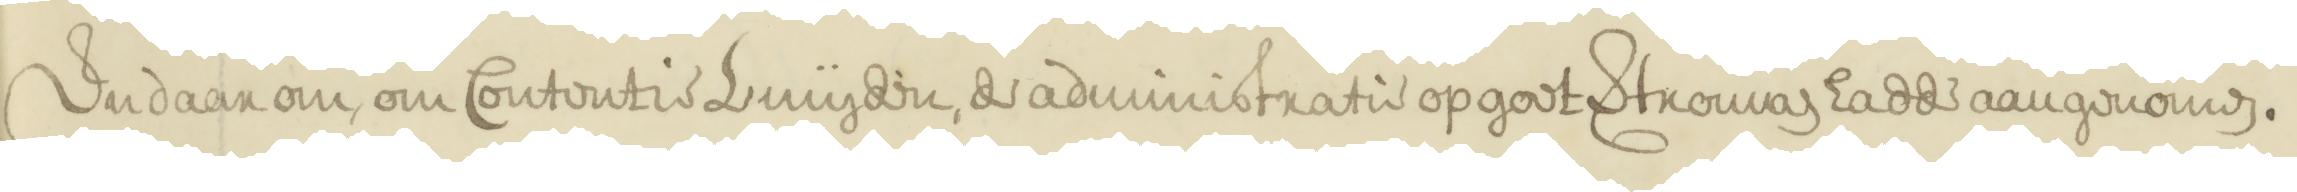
En daar om, om Contentie te mijden, de administratie op goet vertrouwen hadde aangenomen.
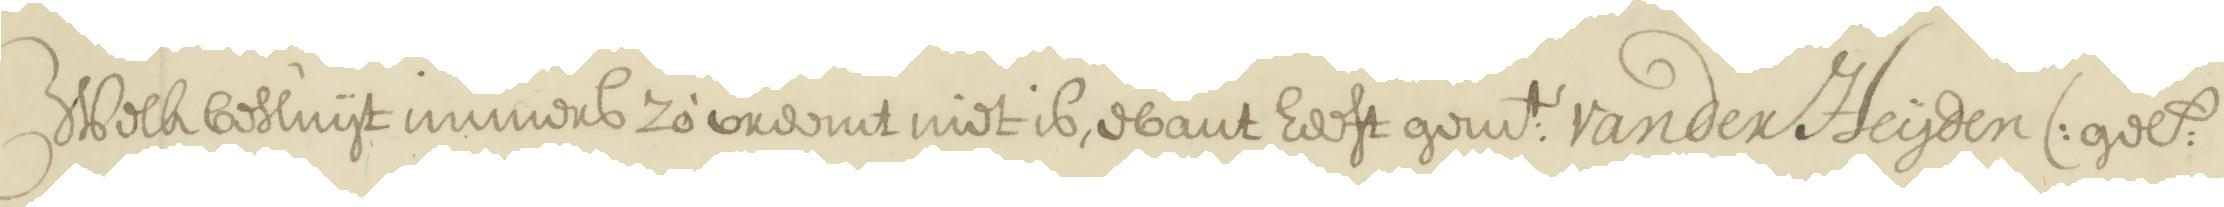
Welk besluijt immers Zo' vreemt niet is, want heeft gem:t van der Heijden (:gelijk
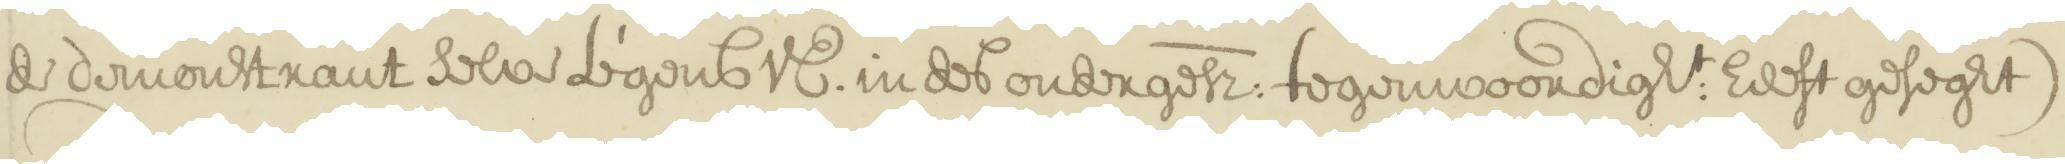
de demonstrant selve tegens VE. in des ondergesz: tegenwoordigh:t heeft geseght)
